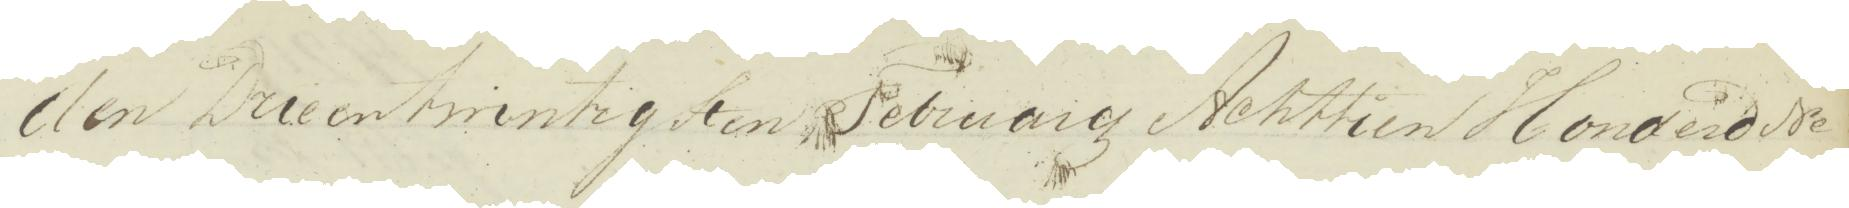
den Drie en twintigsten February Achttien Honderd Ne
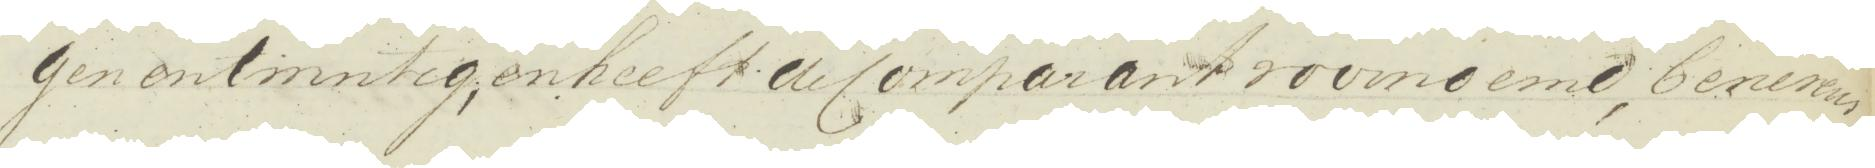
gen entwintig, en heeft de Comparant voornoemd, benevens
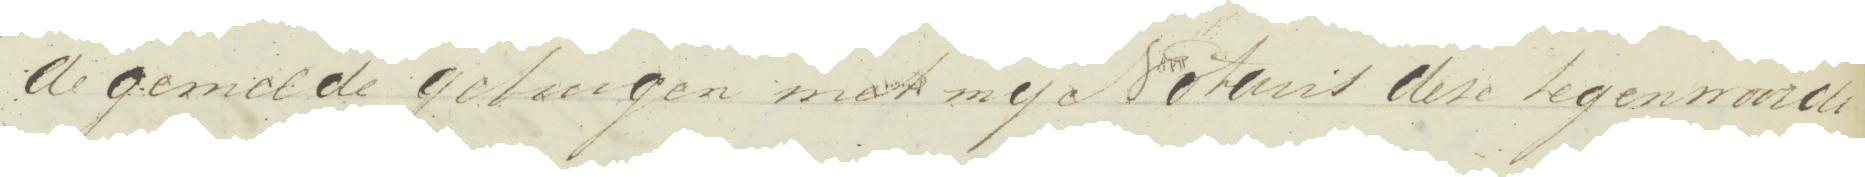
de gemelde getuigen met my Notaris deze tegenwoordi
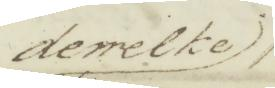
dewelke
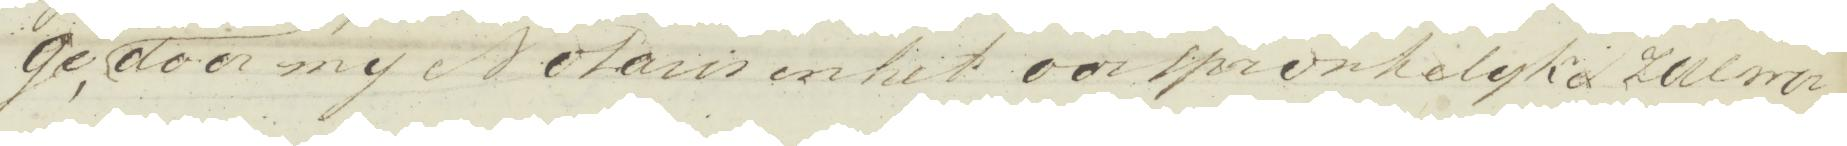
ge, door my Notaris en het oorspronkelyke zal wor
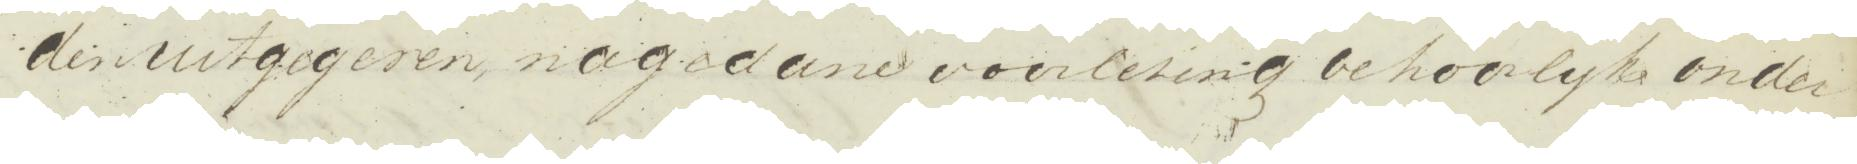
den uitgegeven, nagedane voorlezing behoorlyk onder
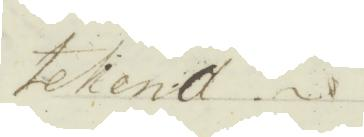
tekend.
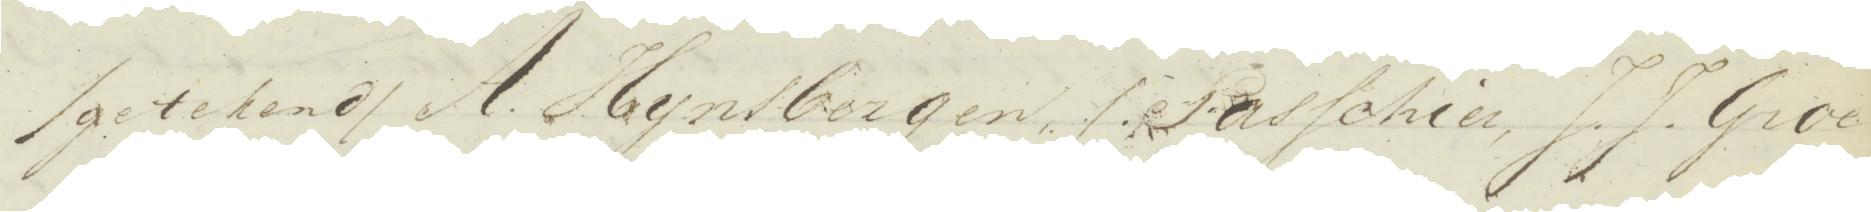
/getekend/ A. Hynsbergen, C: Passchier, J:J. Groe
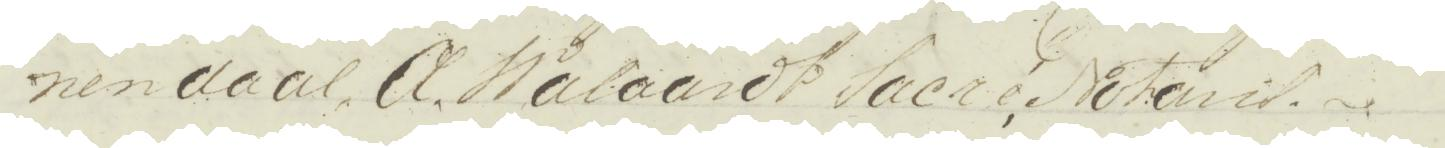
nendaal, AE. Walaardt Sacré, Notaris.
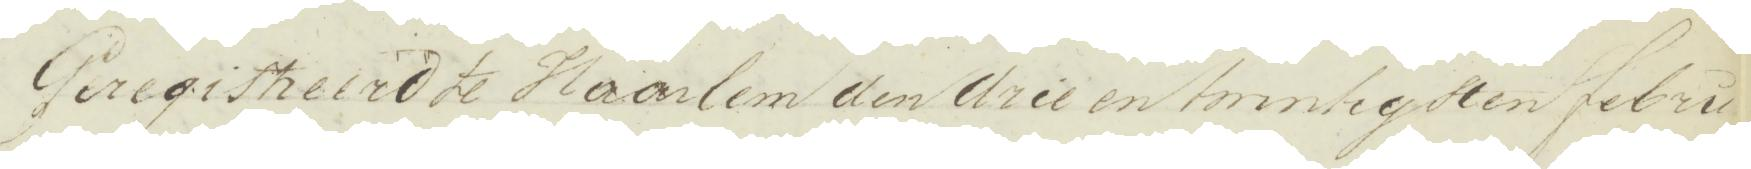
Geregisteerd te Haarlem den drie en twintigsten febru
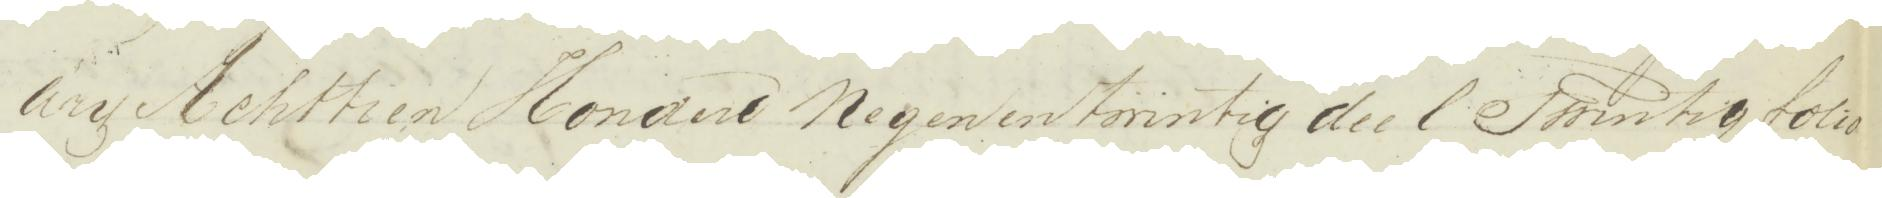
ary Achttien Honderd Negen en twintig deel Twintig folio
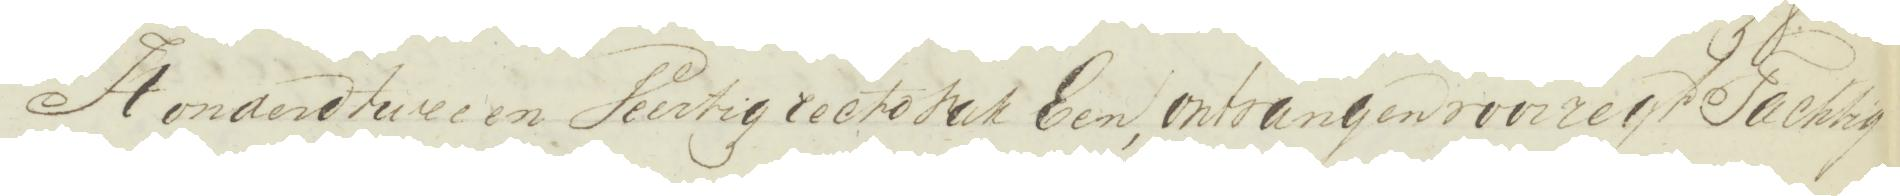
Honderd twee en Veertig recto vak Een, ontvangen voorregt Tachtig
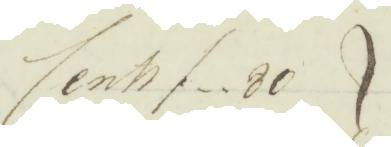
Cents ƒ- . 80
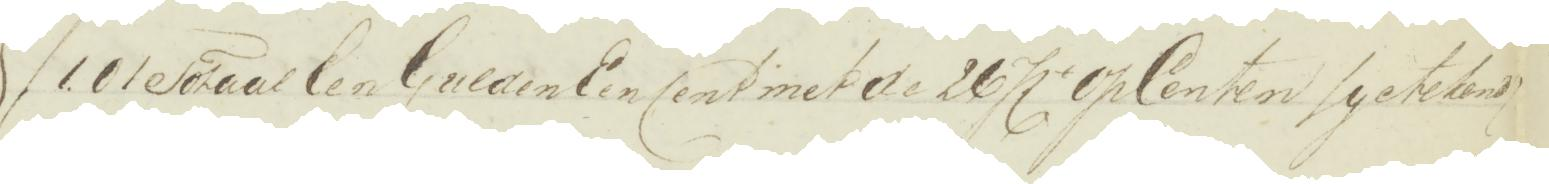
ƒ 1. 01 Totaal Een Gulden Een Cent met de 26 pCt opcenten /getekend/
